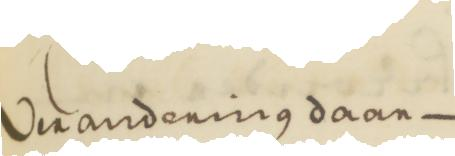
Verandering daar
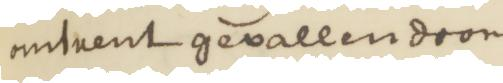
omtrent gevallen door
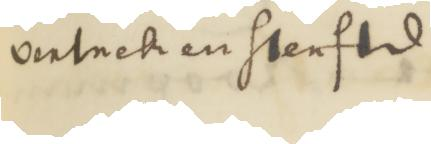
vertrek en sterfte
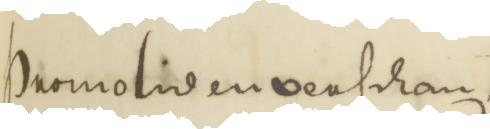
Promotie en verschan
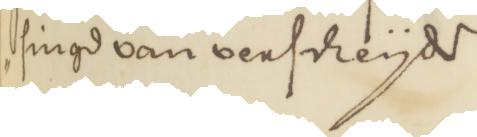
„ singe van verscheijde
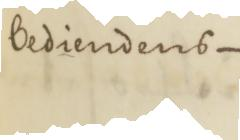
bediendens
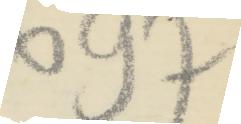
697
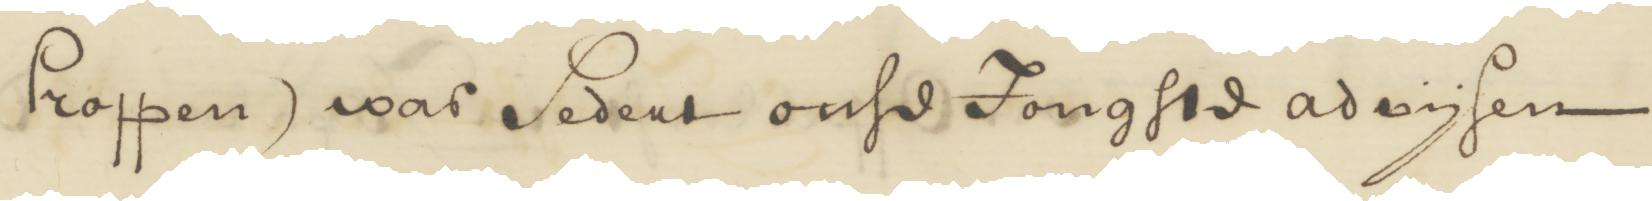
koppen) was sedert onse Jongste advijsen
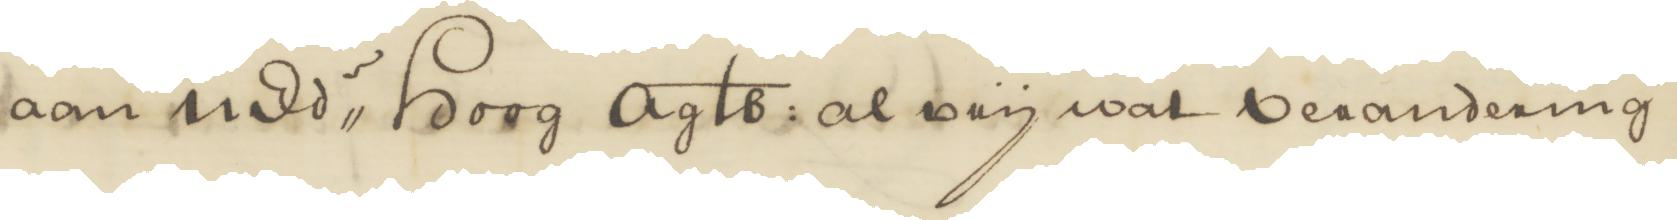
aan UEd„e Hoog Agtb: al vrij wat verandering
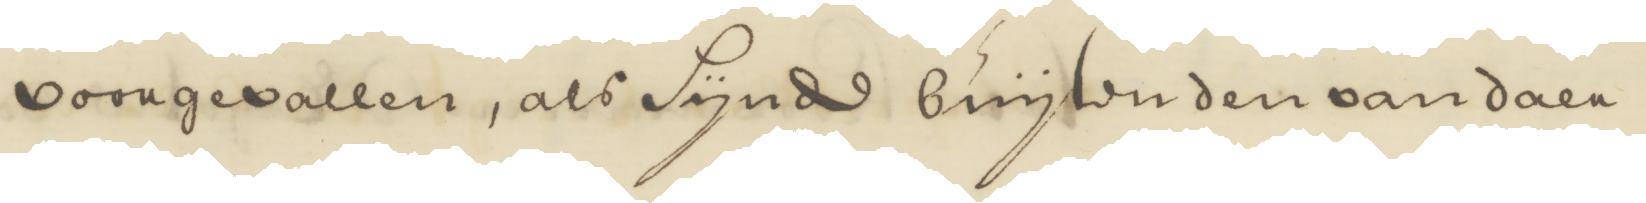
voor gevallen, als sijnde buijten den van daer
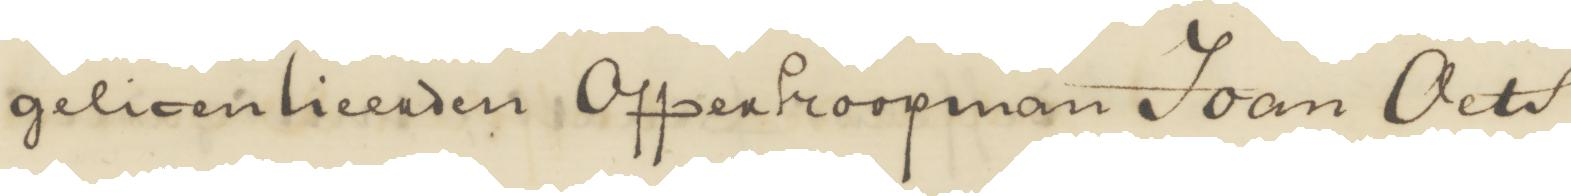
gelicentieerden Opperkoopman Joan Oets
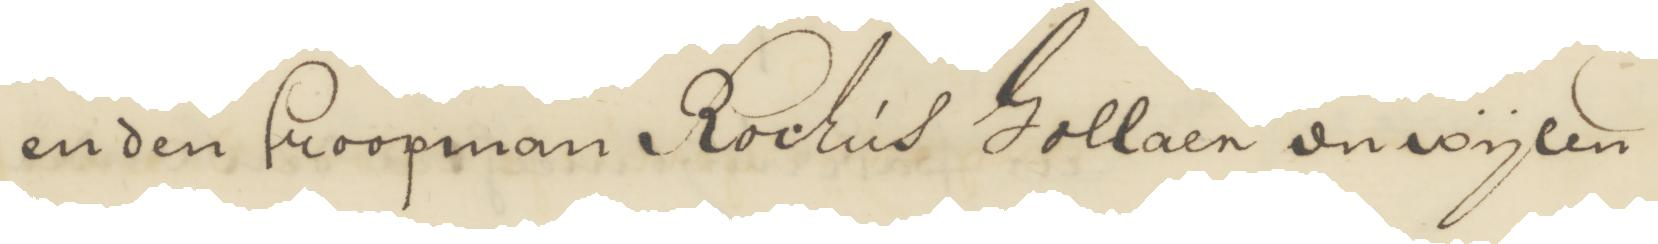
en den koopman Rochus Hollaer en wijlen
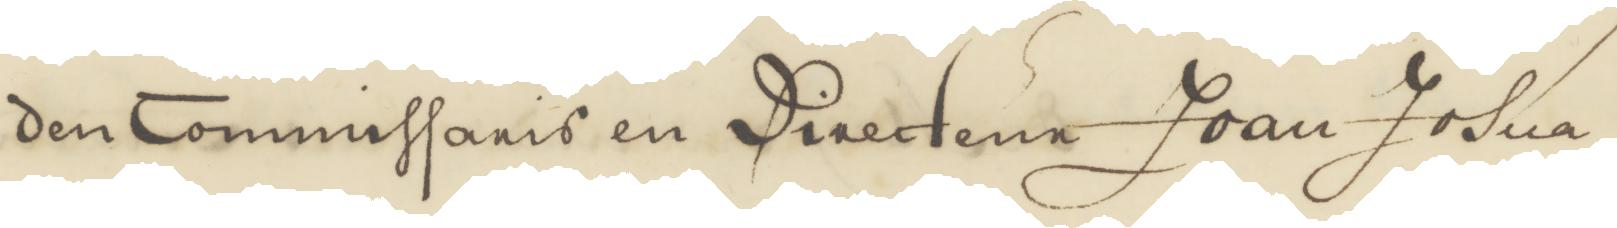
den Commissaris en Directeur Joan Josua
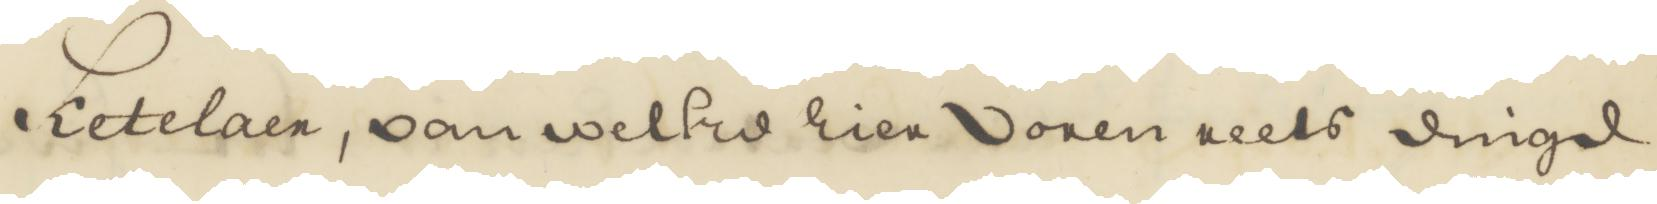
ketelaer, van welke hier voren reets enige
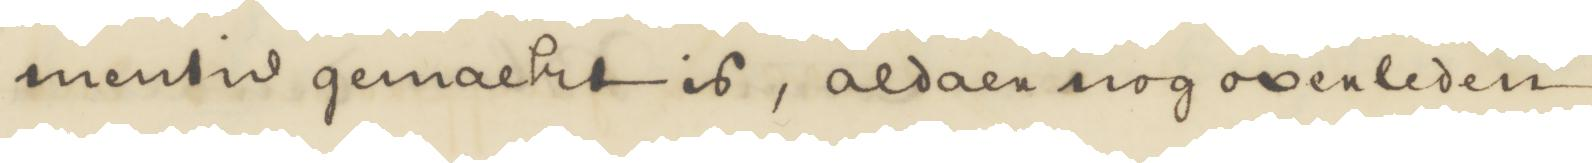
mentie gemaekt is, aldaer nog overleden
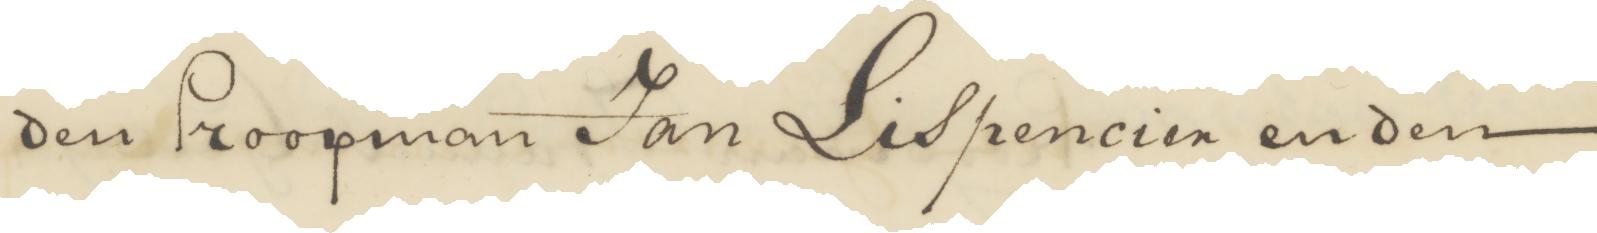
den koopman Jan Lispencier en den
